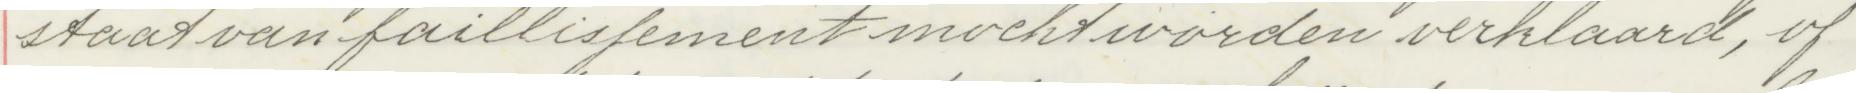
staat van faillissement mocht worden verklaard, of
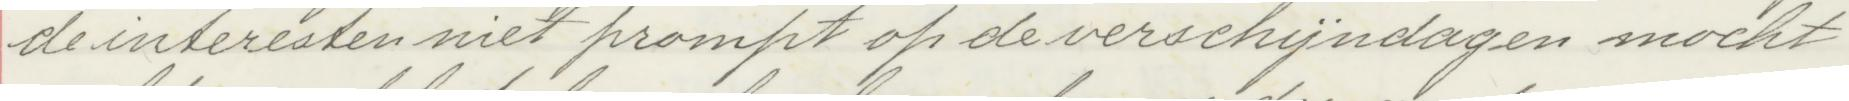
de interesten niet prompt op de verschijndagen mocht
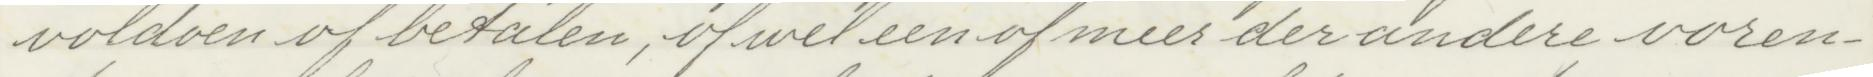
voldoen of betalen, of wel een of meer der andere voren-
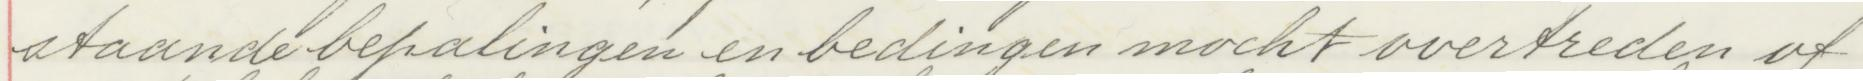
staande bepalingen en bedingen mocht overtreden of
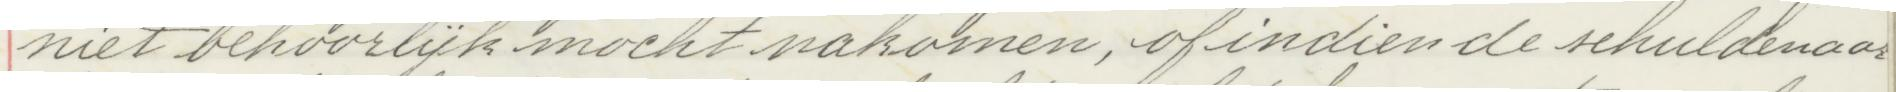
niet behoorlijk mocht nakomen, of indien de schuldenaar
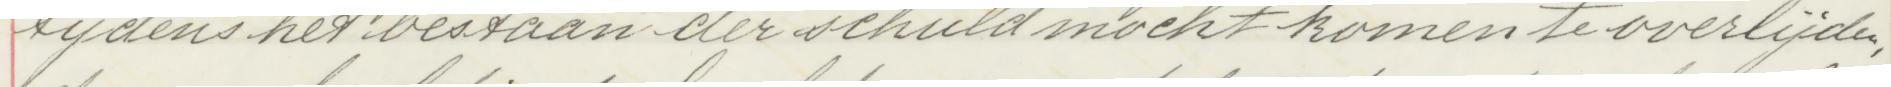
tijdens het bestaan der schuld mocht komen te overlijden,
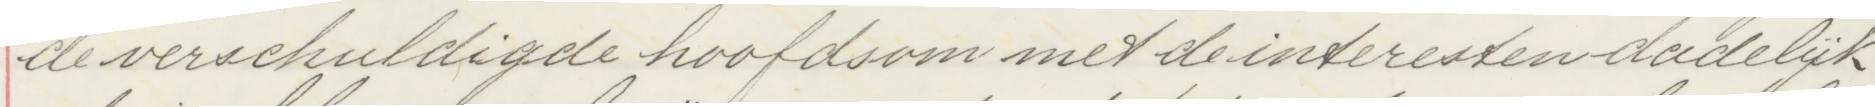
de verschuldigde hoofdsom met de interesten dadelijk
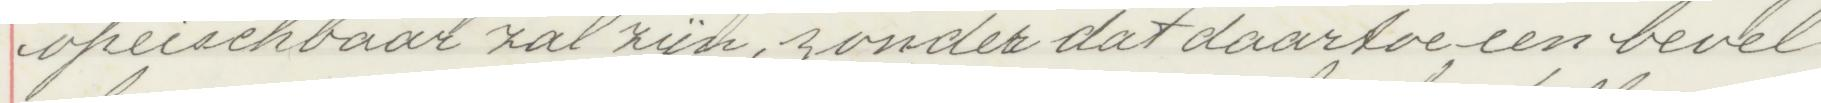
opeischbaar zal zijn, zonder dat daartoe een bevel
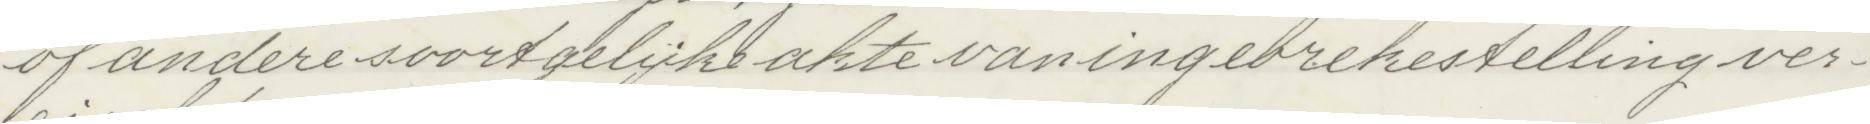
of andere soortgelijk acte van ingebrekestelling ver-
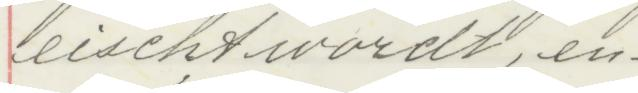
eischt wordt, en
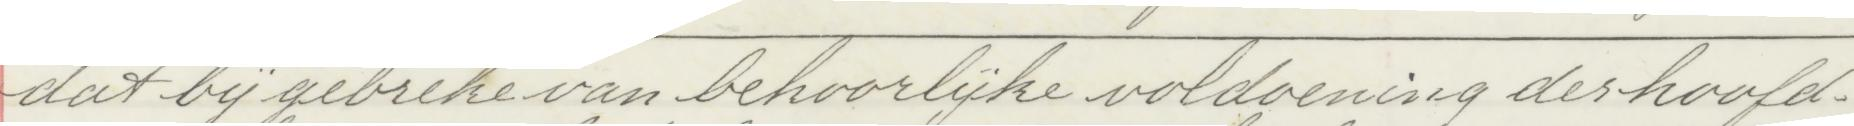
dat bij gebreke van behoorlijke voldoening der hoofd.
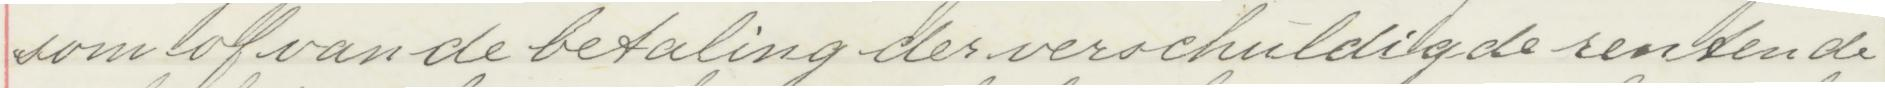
som of van de betaling der verschuldigde renten de
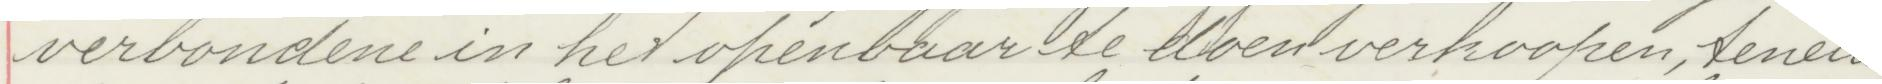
verbondene in het openbaar te doen verkoopen, tenein
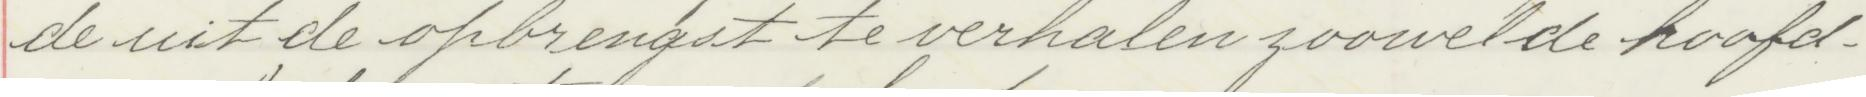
de uit de opbrengst te verhalen zoowel de hoofd-
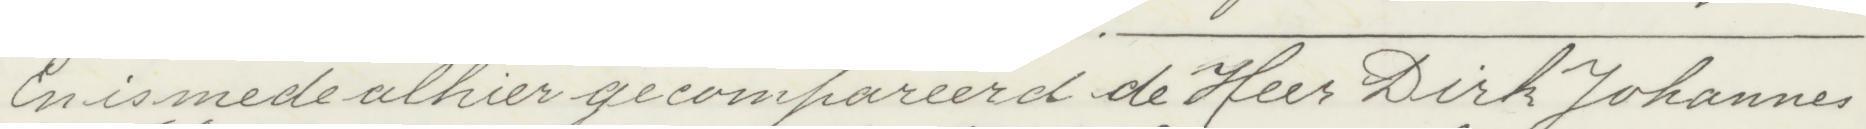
En is mede alhier gecompareerd de Heer Dirk Johannes
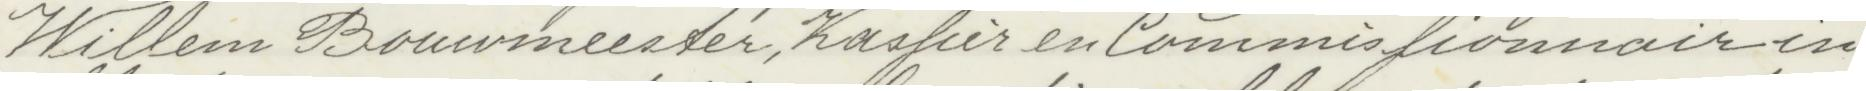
Willem Bouwmeester, Kassier en Commissionnair in
